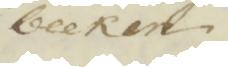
beeken
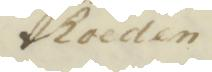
Roeden
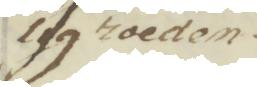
tig roeden.
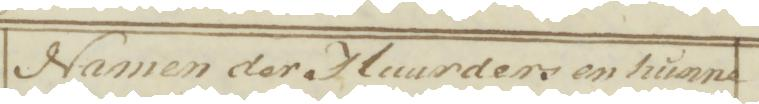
Namen der Huurders en hunne
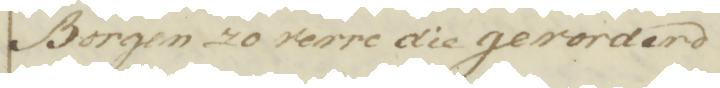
Borgen zo verre die gevorderd
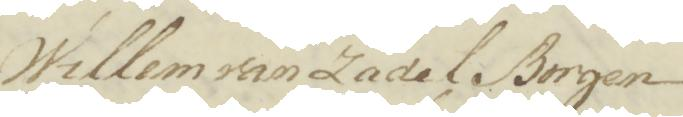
Willem van Zadel Borgen
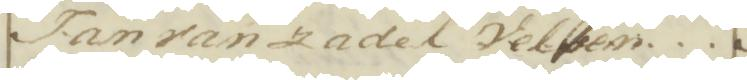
Jan van Zadel Velsen . . .
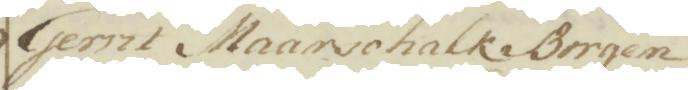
Gerrit Maarschalk Borgen
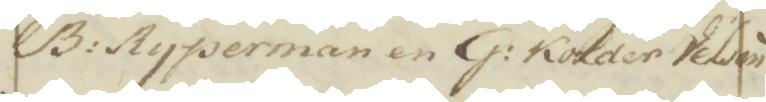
B: Ryperman en G: Kolder Velse
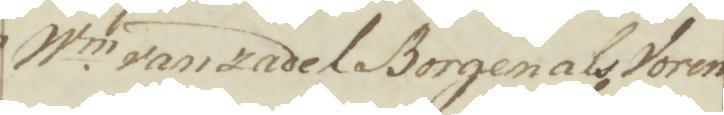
W.m van zadel Borgen als Voren
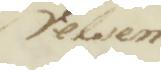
Velsen
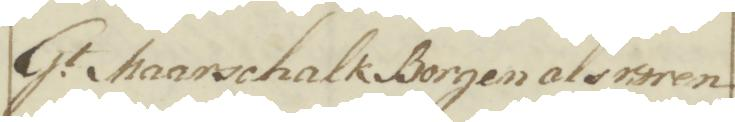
G.t Maarschalk Borgen als voren
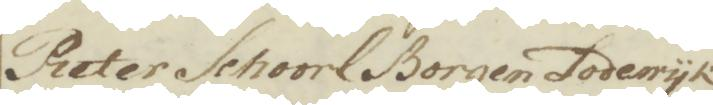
Pieter Schoorl Borgen Lodewijk
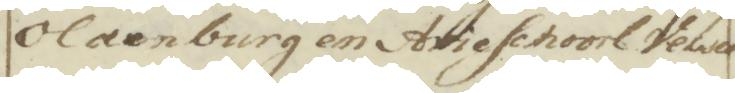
Oldenburg en Arie Schoorl Vels
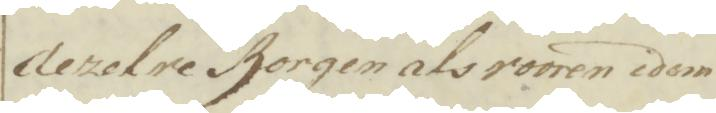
dezelve Borgen als vooren idem
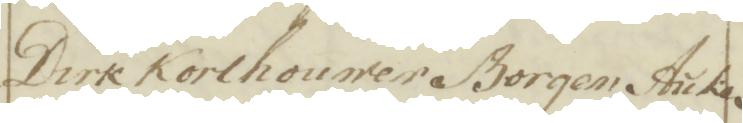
Dirk Korthouwer Borgen Auke
